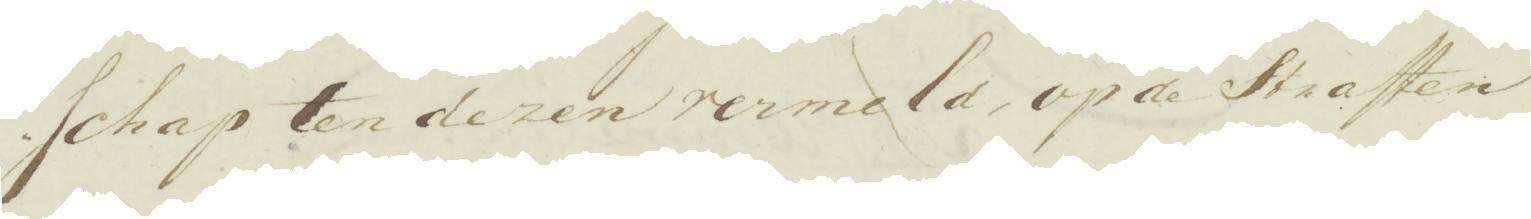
„schap ten dezen vermeld, op de straffen
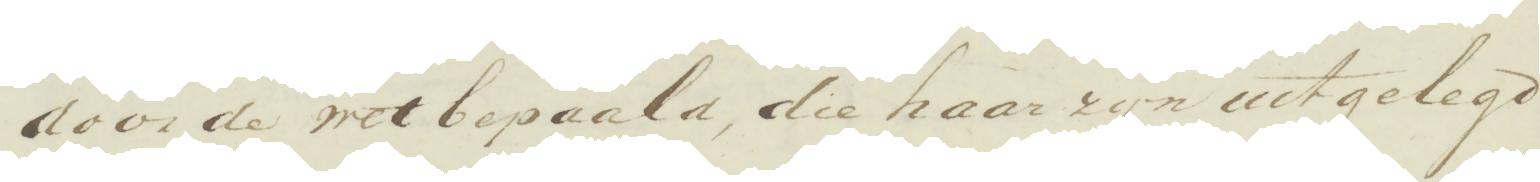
door de wet bepaald, die haar zyn uitgelegd
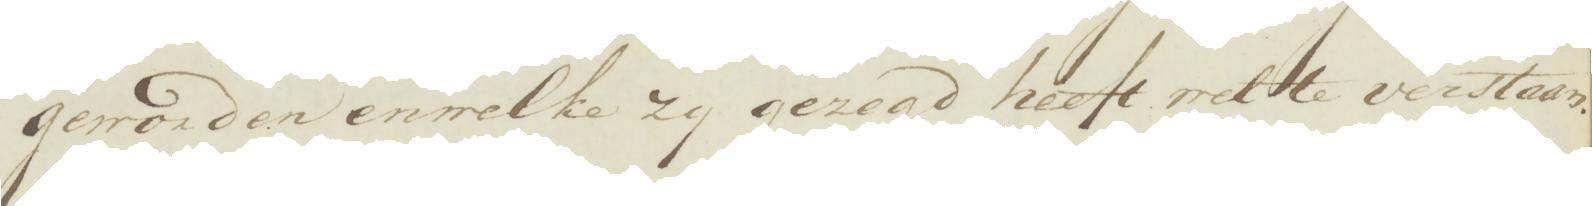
geworden en welke zy gezegd heeft wel te verstaan.
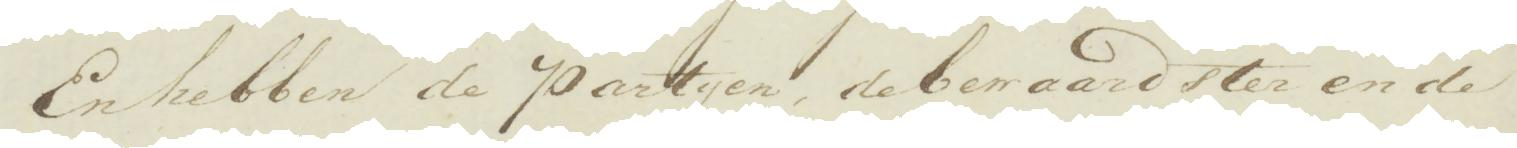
En hebben de partyen, de bewaardster en de
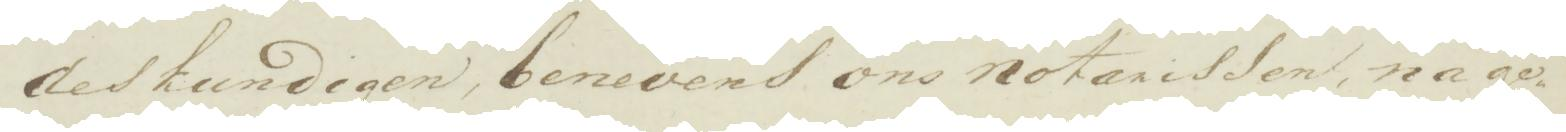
deskundigen, benevens ons notarissen, na ge„
